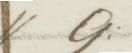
„ 9:
